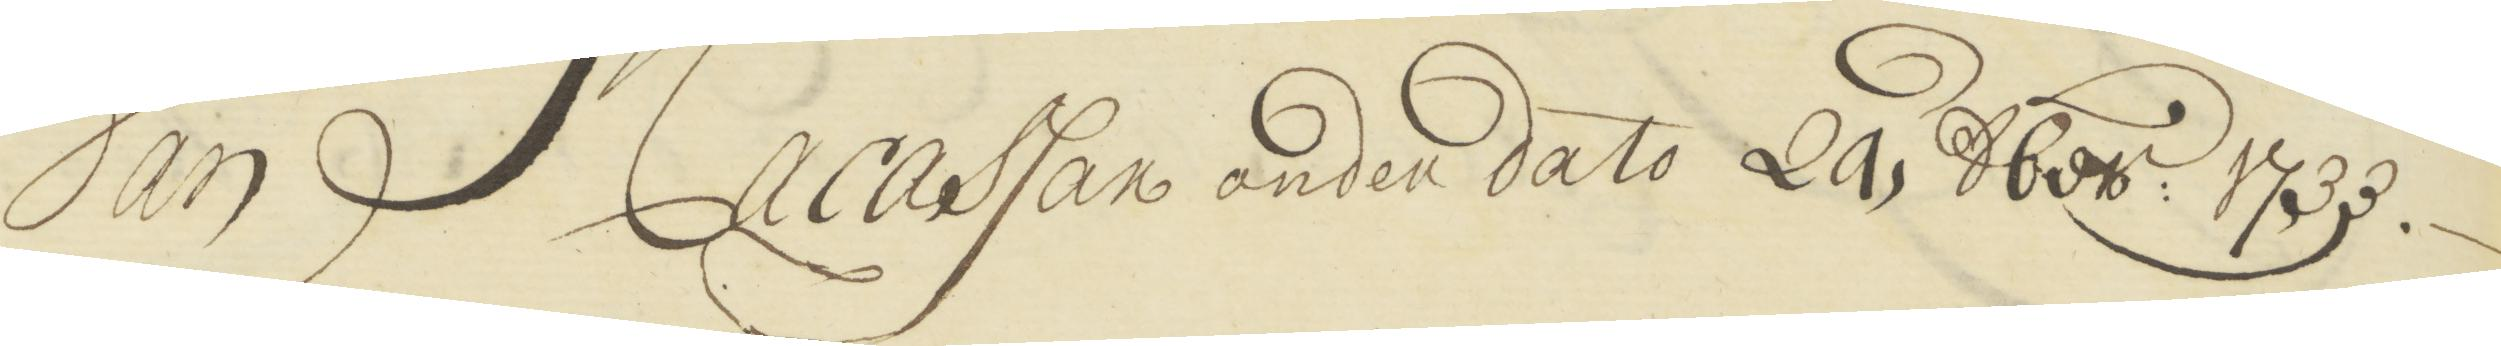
Van Macassar onder dato 24,' 8ber: 1733. —
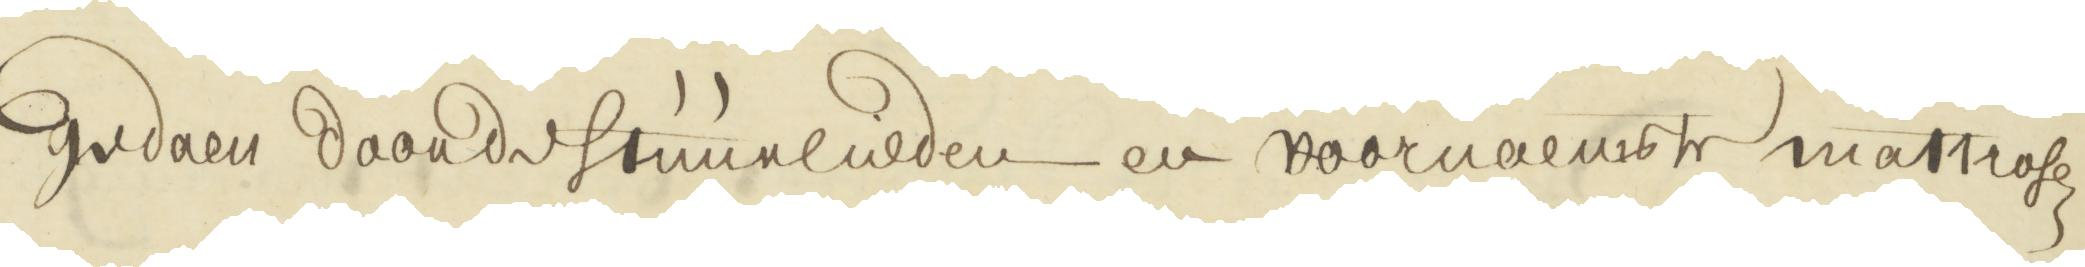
gedaen door de stuurlieden en voornaemste mattrosen
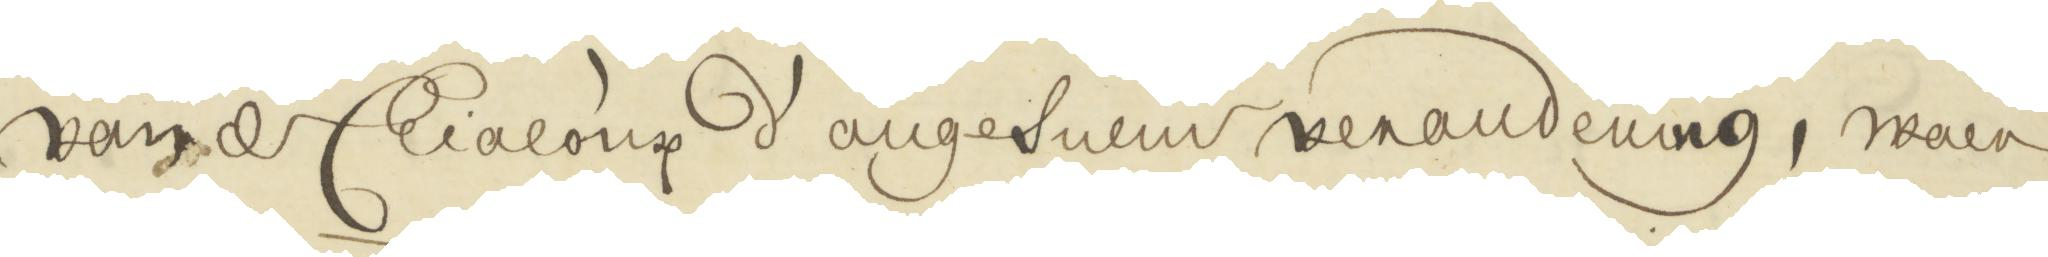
van de Chialoup d’ ongesiene verandering, waer
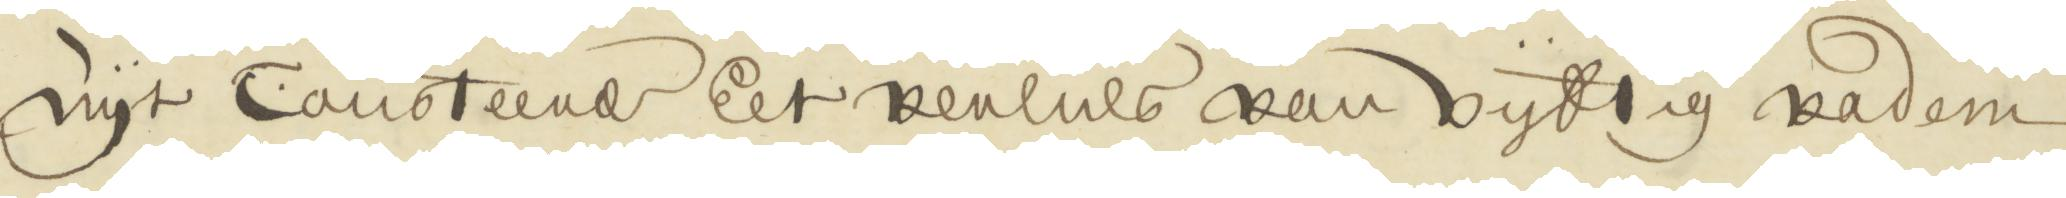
uijt consteerde het verlies van vijftig vadem
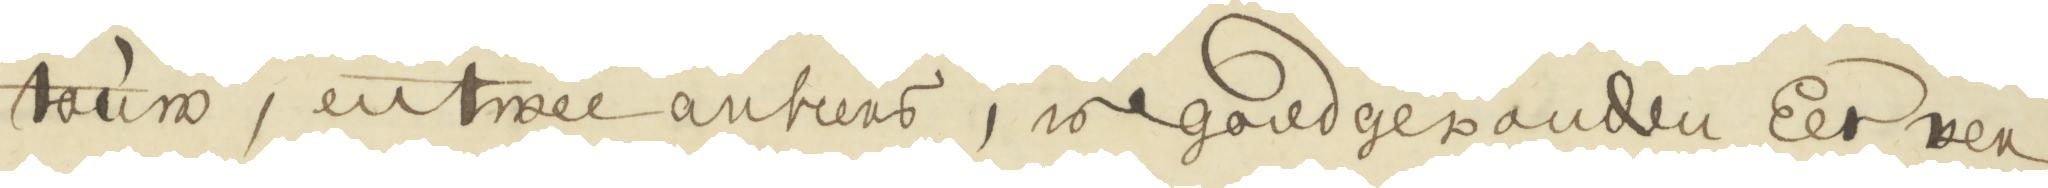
touw, en twee ankers, is goed gevonden het ver
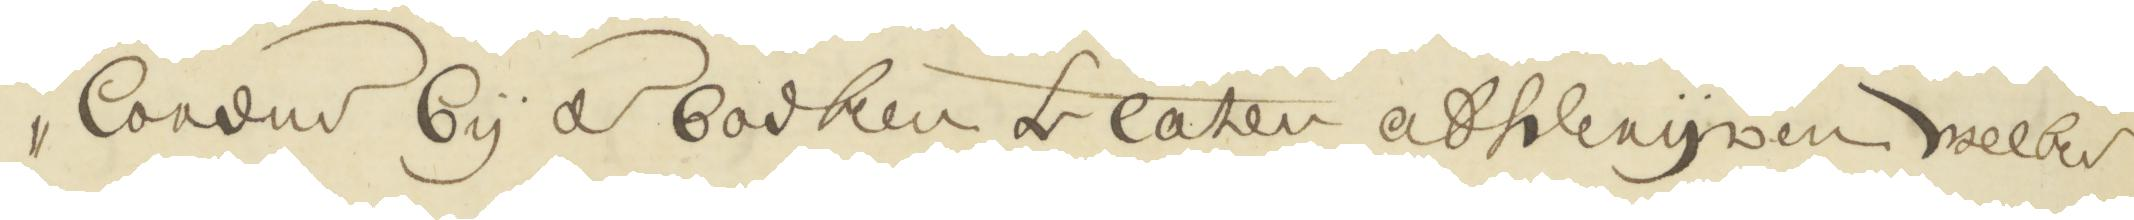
„lorene bij de boeken te laten afschrijven welke
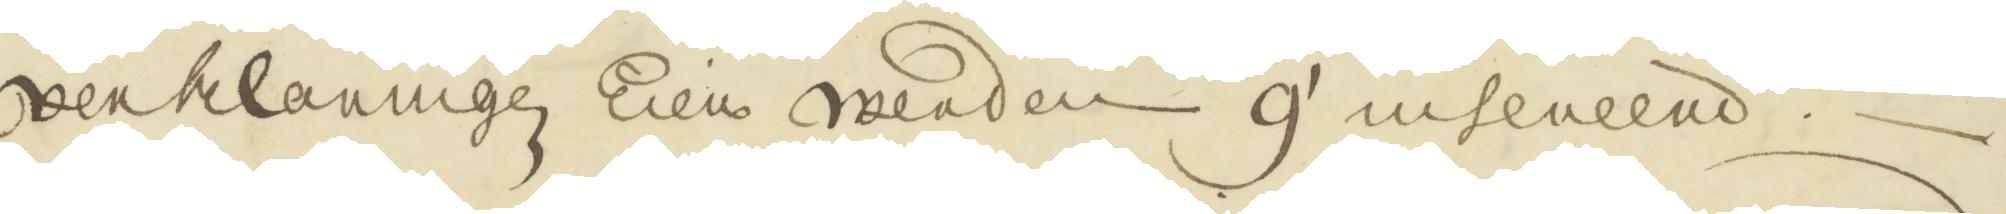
verklaringen hier werden g’ insereerd. —
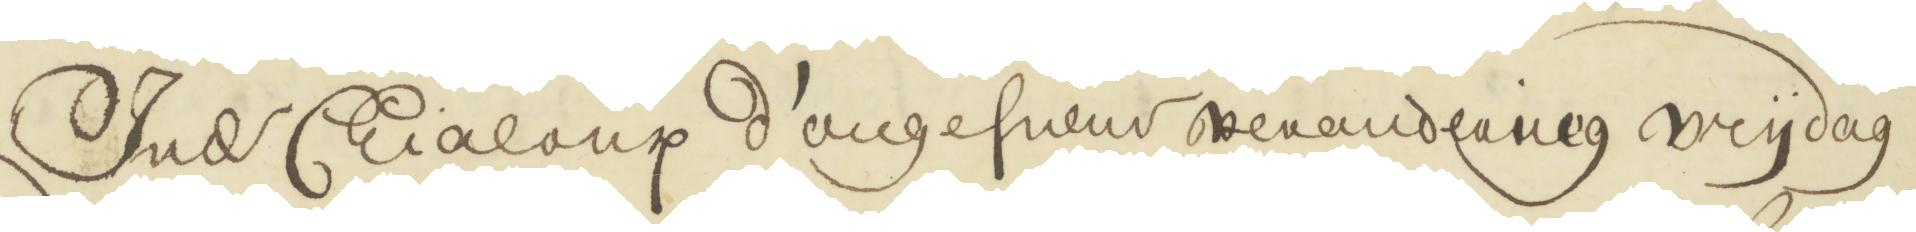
Inde Chialoup d’ ongesiene verandering vrijdag
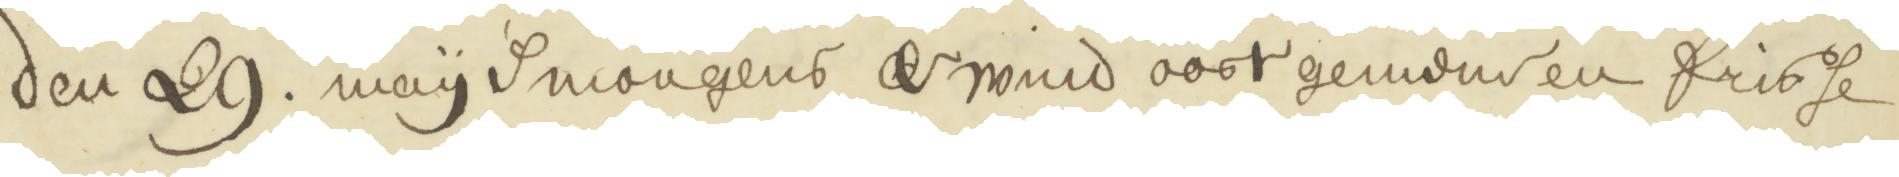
den 29.o maij 's morgens de wind oost gemene en frisse
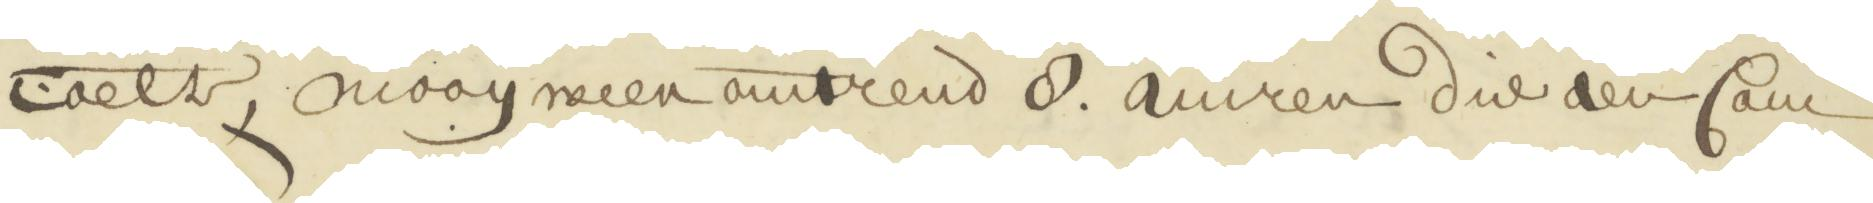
coelte, mooij weer omtrend 8. uuren die den Com
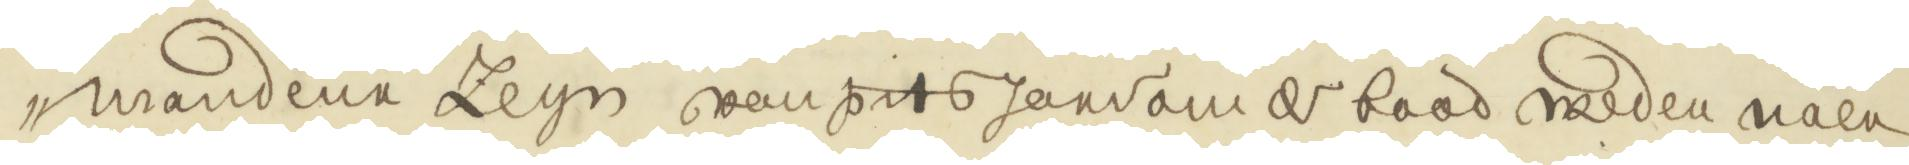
„mandeur zeijn van pits Jare om de bood weder naer
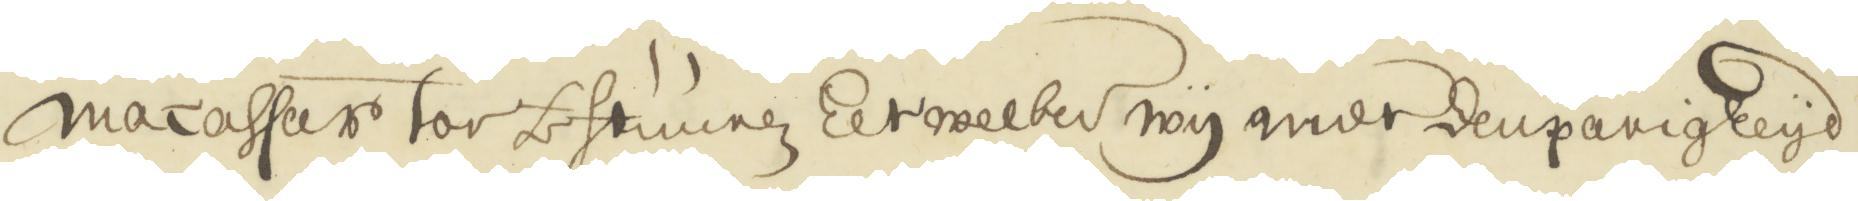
macassar toe te stuuren het welke wij met Eenparigheijd
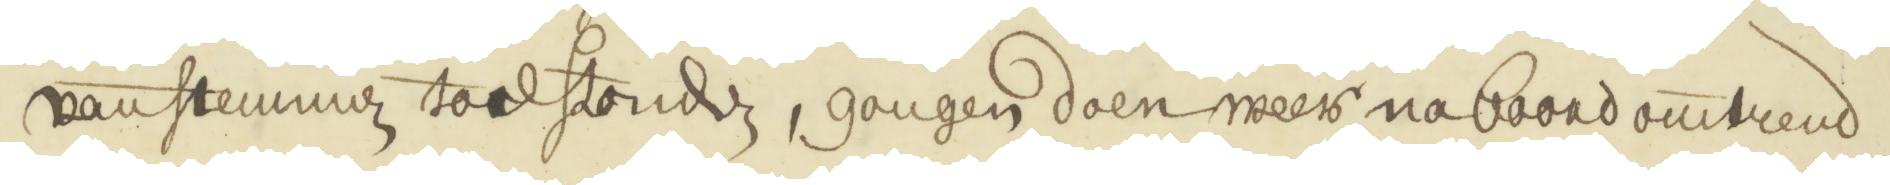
van stemmen toestonden, gongen doen weer na boord omtrend
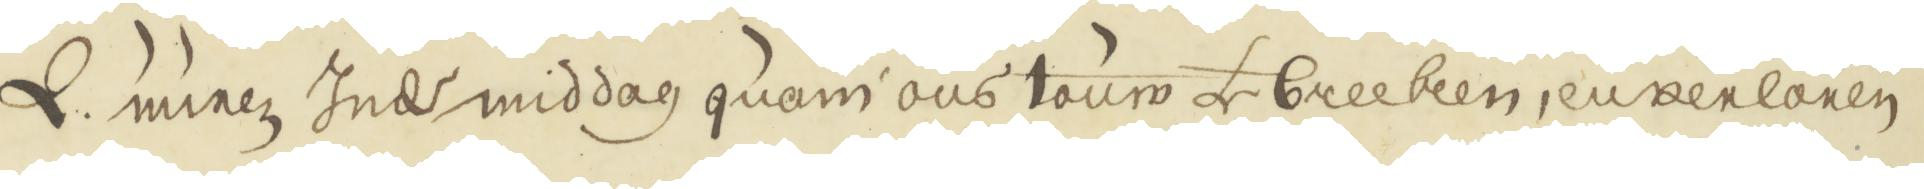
2. uuren Jnde middag quam ons touw te breeken, en verloren
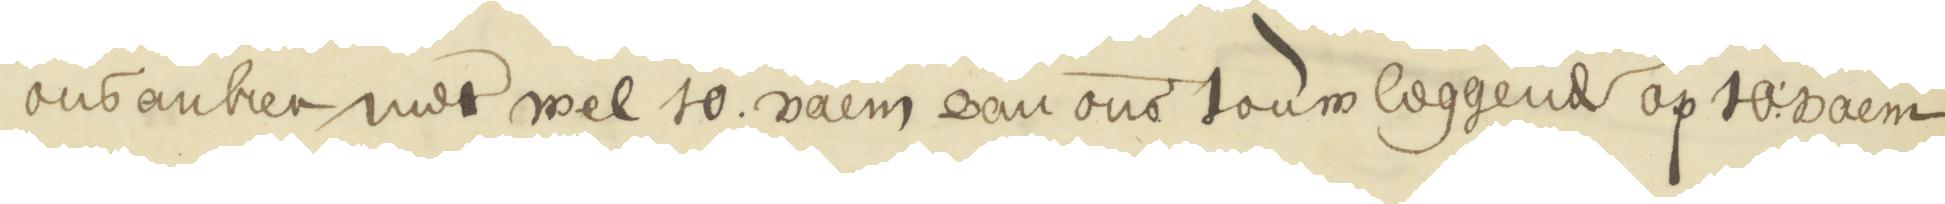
ons anker met wel 10. vaem van ons touw leggende op 10: vaem
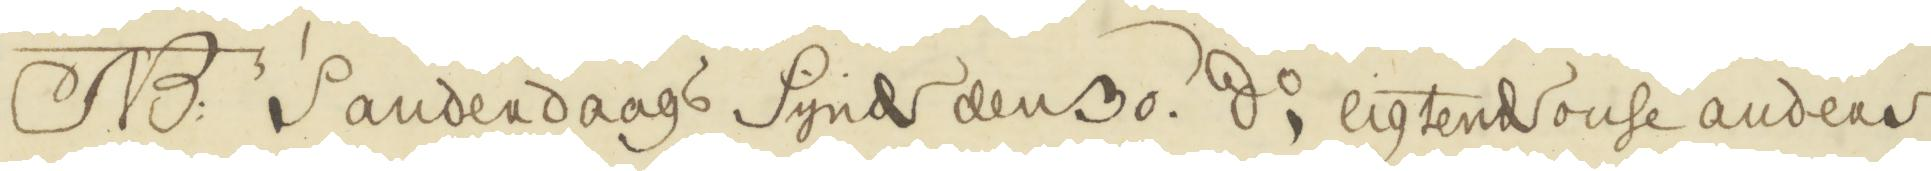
NB: 's anderdaags sijnde den 30.' d,o ligtende onse andere
